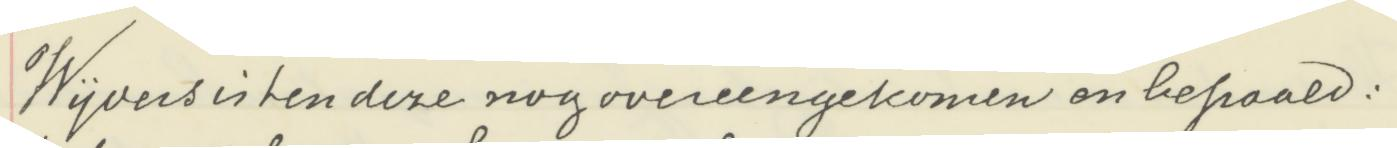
Wijders is ten deze nog overeengekomen en bepaald:
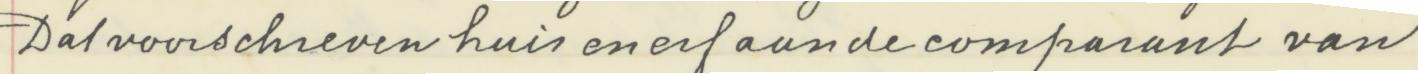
Dat voorschreven huis en erf aan de comparant van
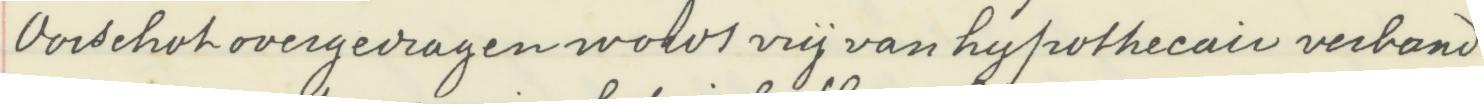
Oorschot overgedragen wordt vrij van hypothecair verband
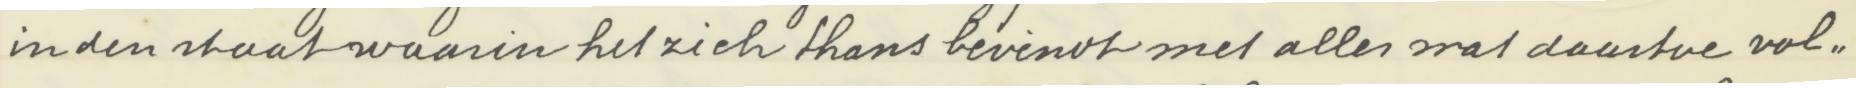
in den staat waarin het zich thans bevindt met alles wat daartoe vol„
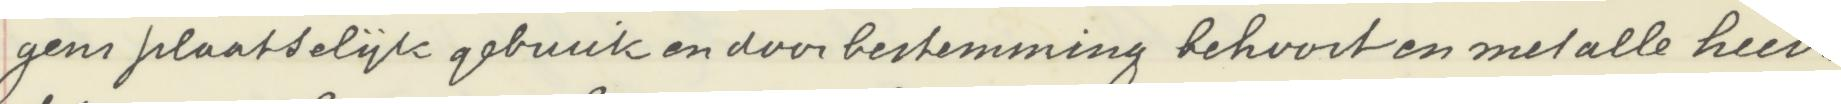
gens plaatselijk gebruik en door bestemming behoort en met alle heer
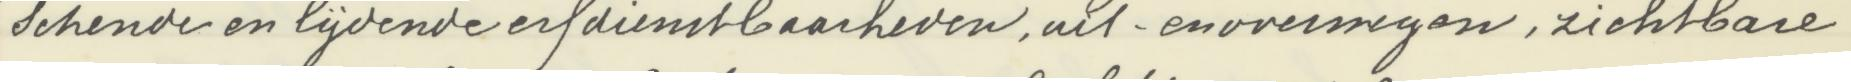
schende en lijdende erfdienstbaarheden, uit- en overwegen, zichtbare
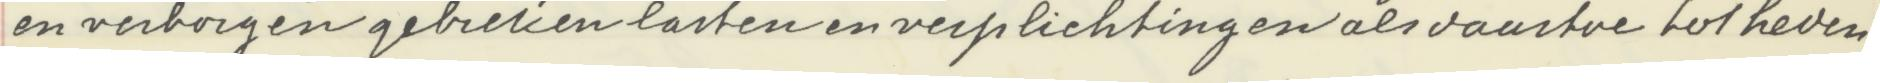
en verborgen gebreken lasten en verplichting en als daartoe tot heden
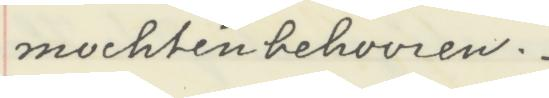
mochten behooren.
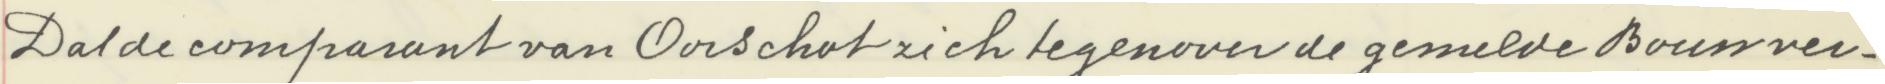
Dat de comparant van Oorschot zich tegenover de gemelde Bouwver-
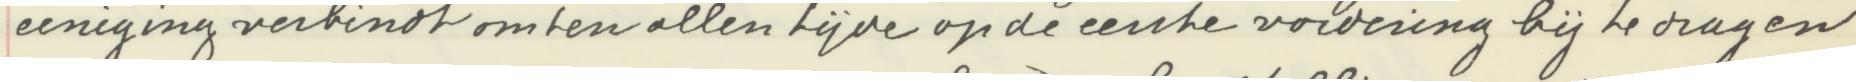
eeniging verbindt om ten allen tijde op de eerste vordering bij te dragen
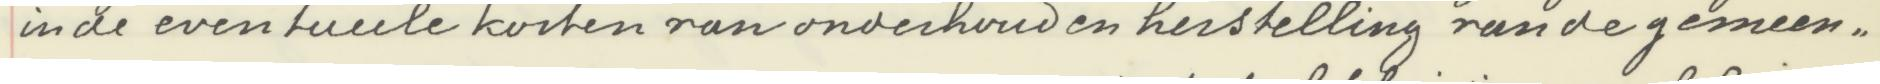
in de eventueele kosten van onderhoud en herstelling van de gemeen„
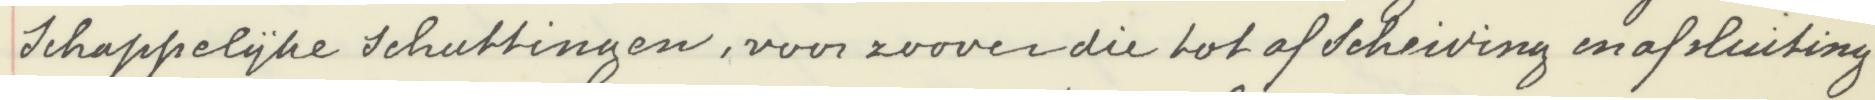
schappelijke schuttingen, voor zoover die tot afscheiding en afsluiting
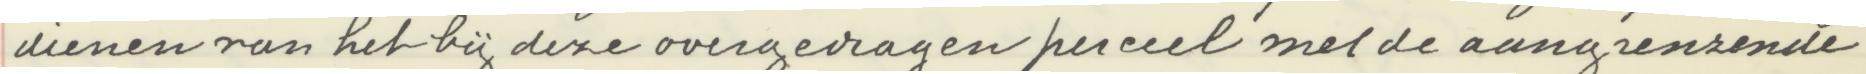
dienen van het bij deze overgedragen perceel met de aangrenzende
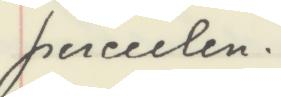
perceelen.
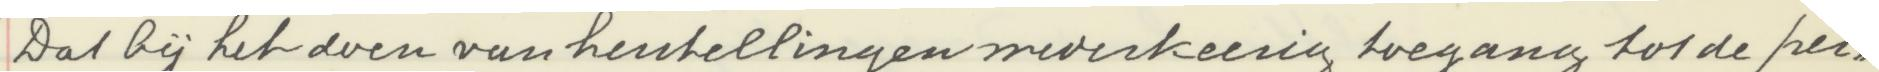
Dat bij het doen van herstellingen wederkeerig toegang tot de per„
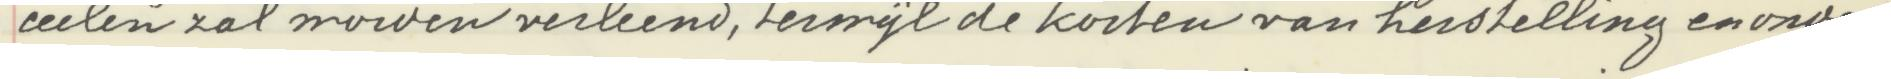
ceelen zal worden verleend, terwijl de kosten van herstelling en onder
